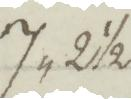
7„ 2½
